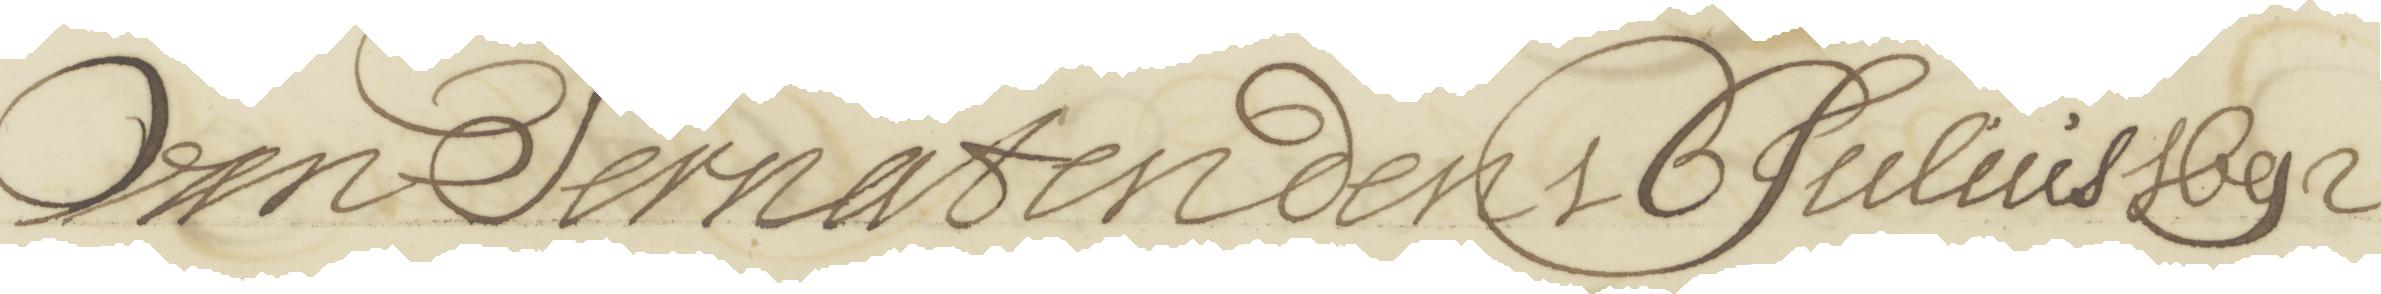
van Ternaten den 16 Julius 1692
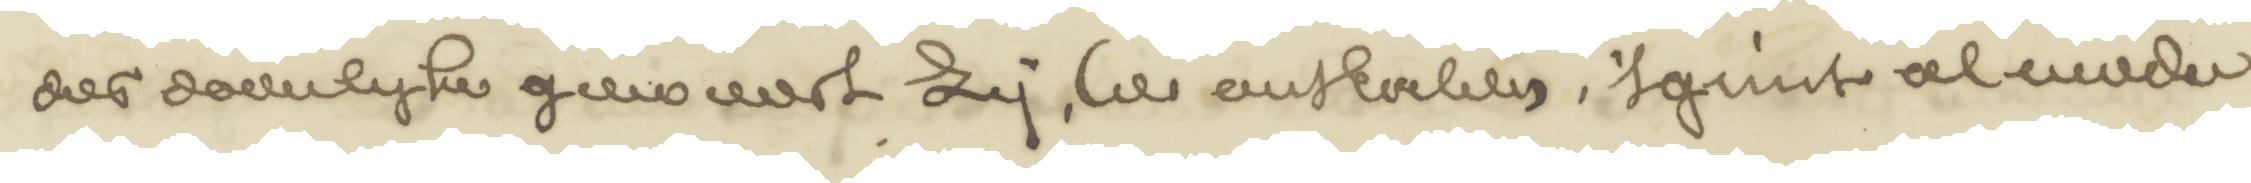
des doenlyk geweest zij, te onthalen, 't gunt al mede
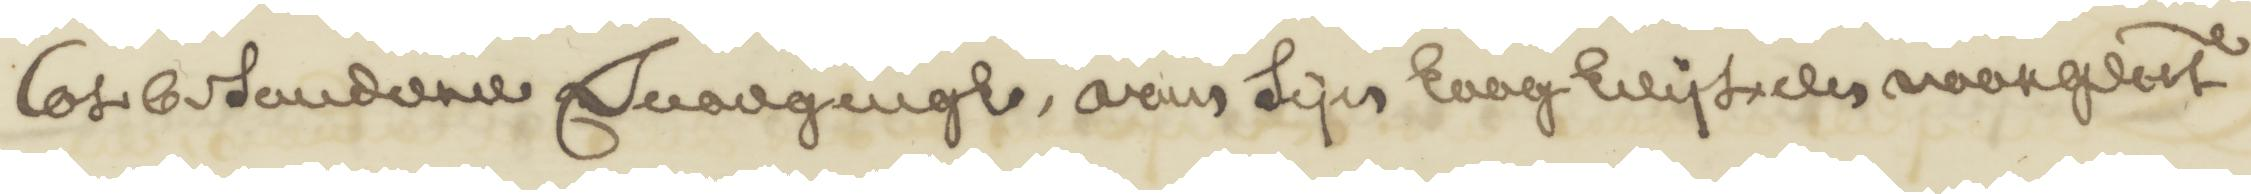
tot besondere vernoegingh, van sijn hoogheijt, en voor gente
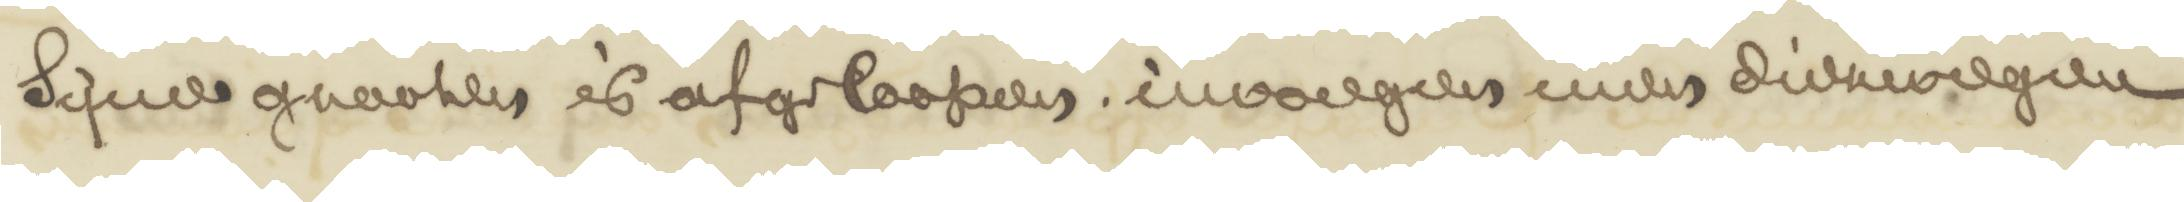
sijne grooten is afgeloopen, invoegen men dierwegen
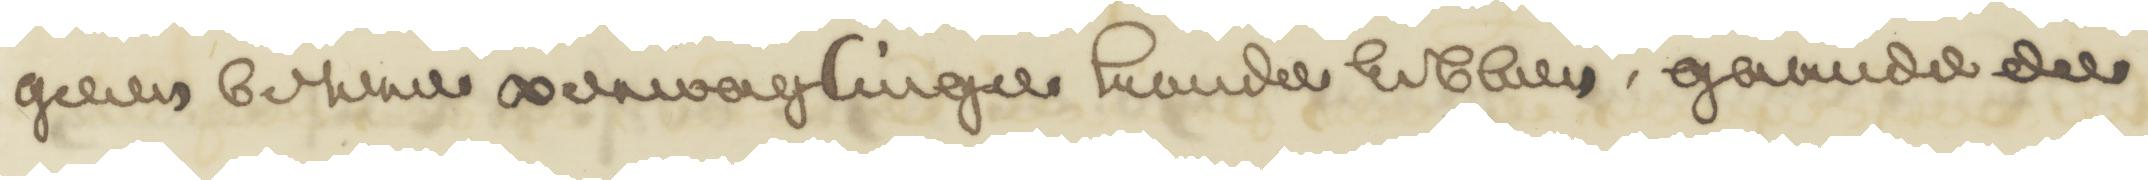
geen betere verwagtinge konde hebben, gaande die
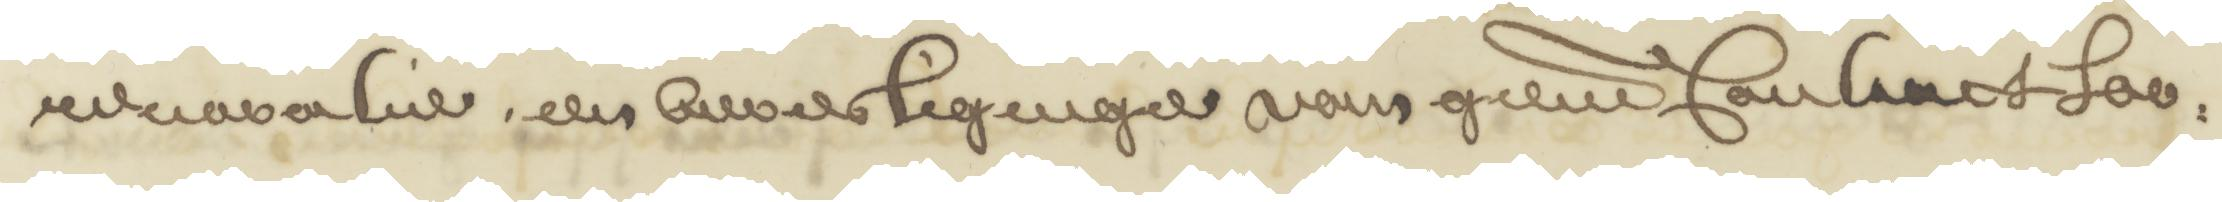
renovatie, een bevestiginge van geene Contract soo:
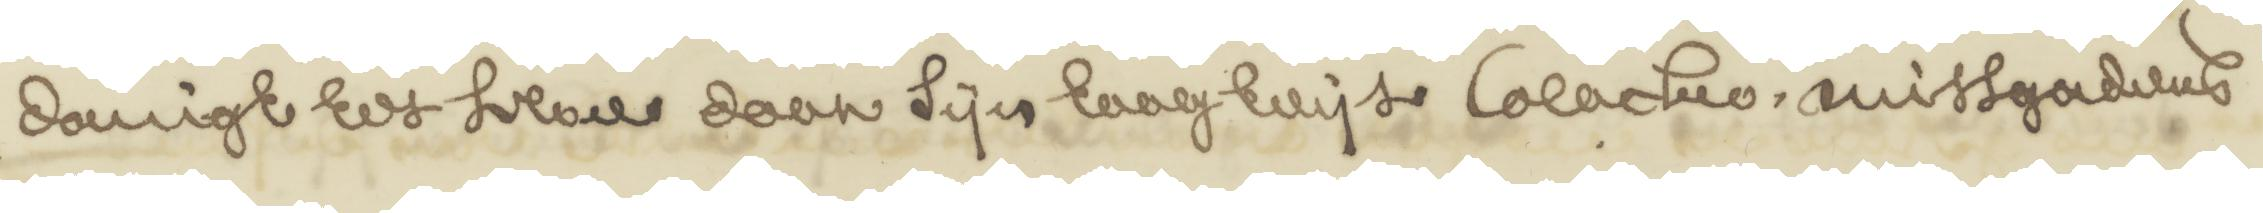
danigh het selve daar sijn hoogheijt tolacko, mitsgaders
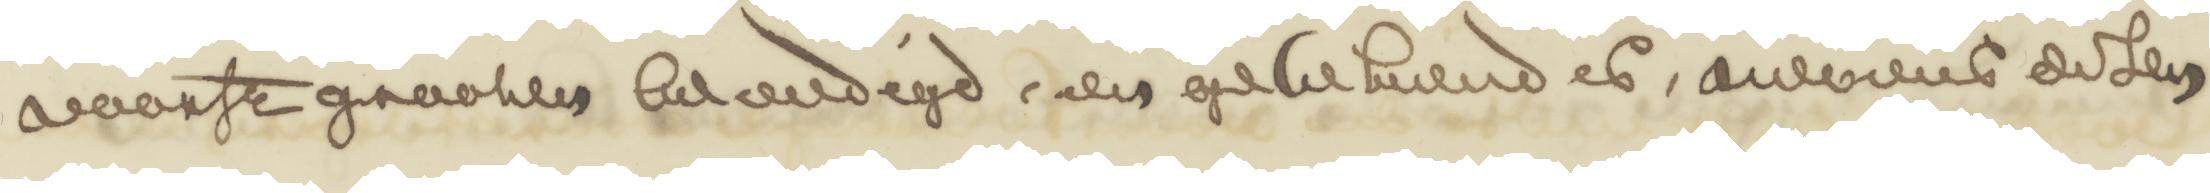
voorsz grooten beeedigd, en getekend is, nevens desen
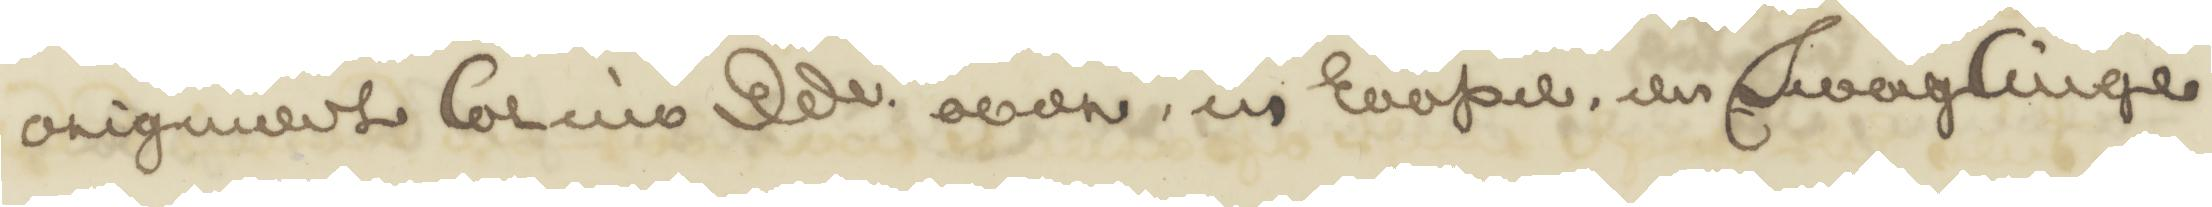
origineele tot uw Ede. over, in hoope, en verwagtinge
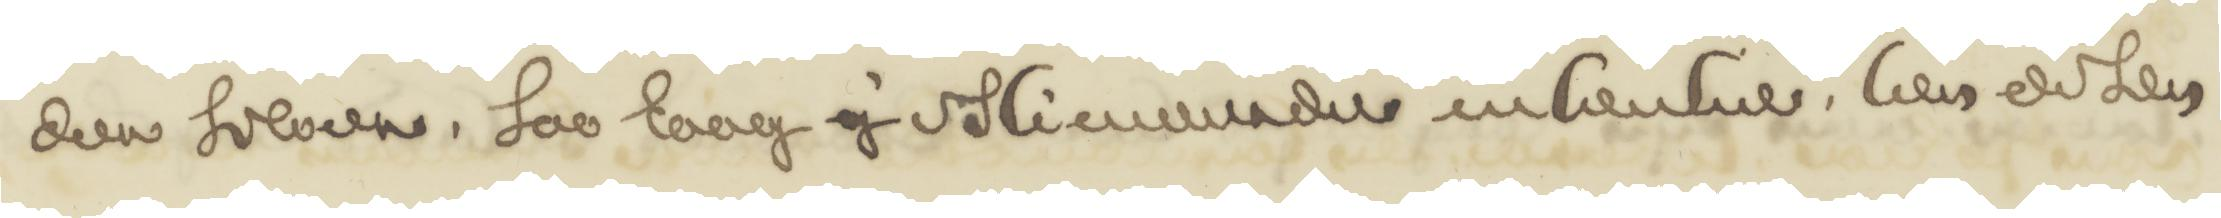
der selver, soo hoog g'estimeerde intentie, ten desen
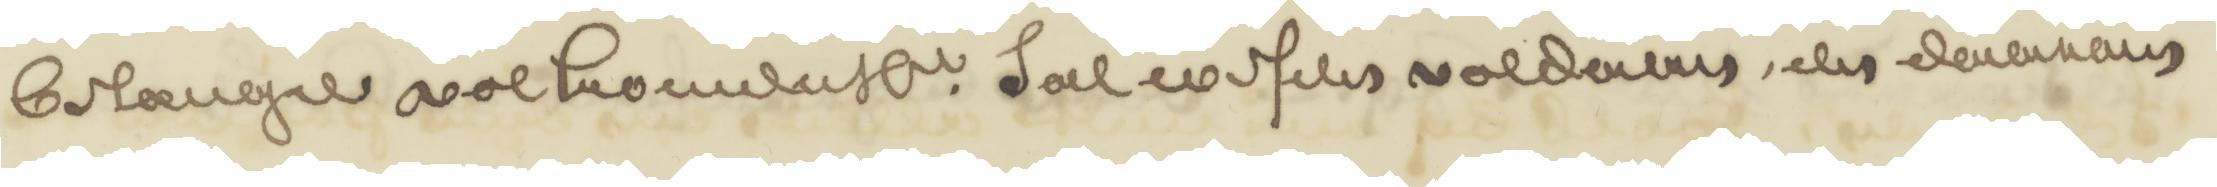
belange volkomentlijk:e sal wesen voldaan, en daarom
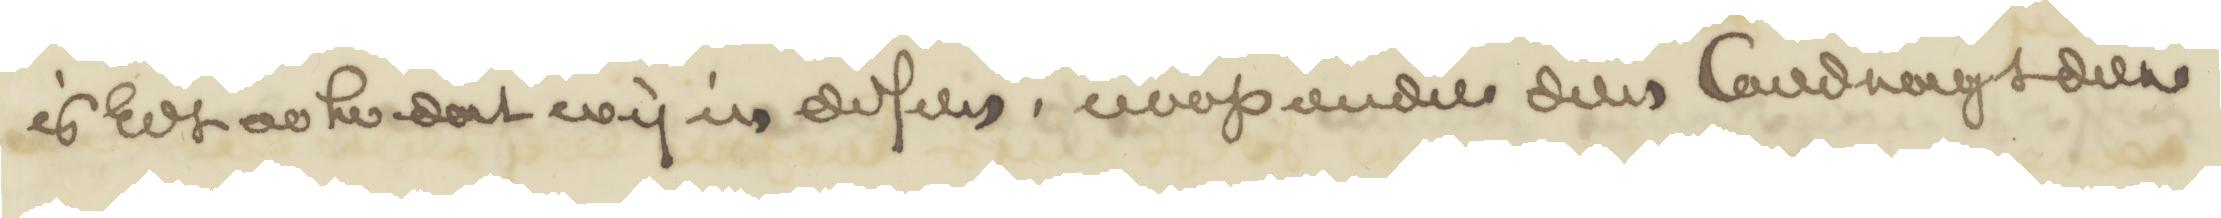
is het ook dat wij in desen, noopende den toedragt der
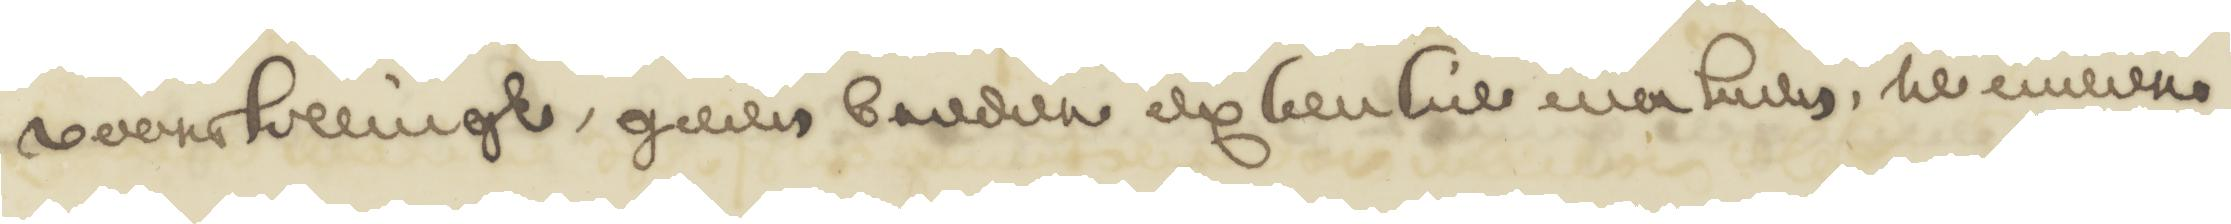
voorstellingh, geen breder extentie maken, te meer
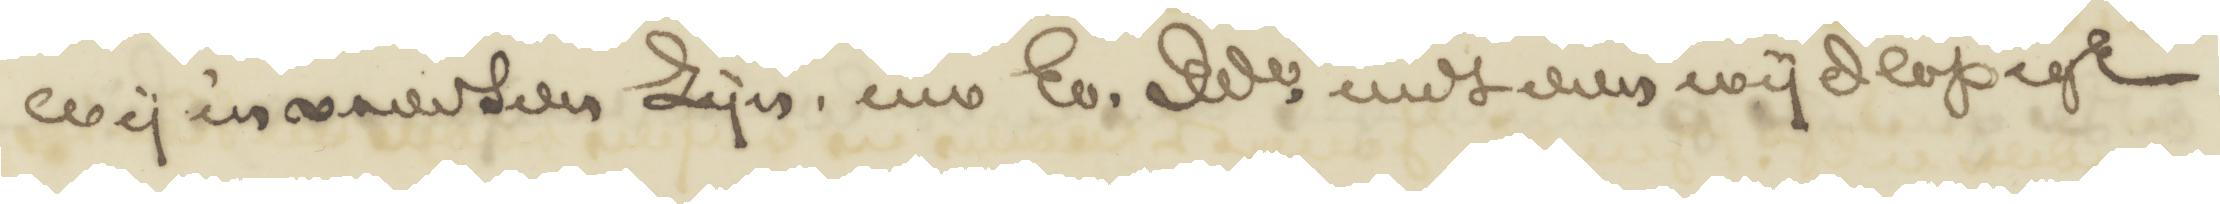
wij in vreesen zijn, uw ho: Ed.e met een wijdlopigh
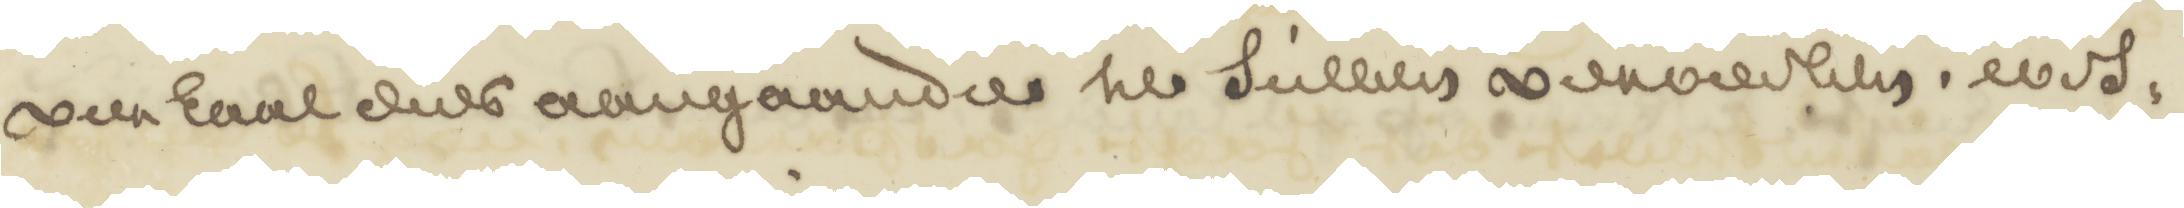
verhaal dies aangaande te sullen verveelen, wes„
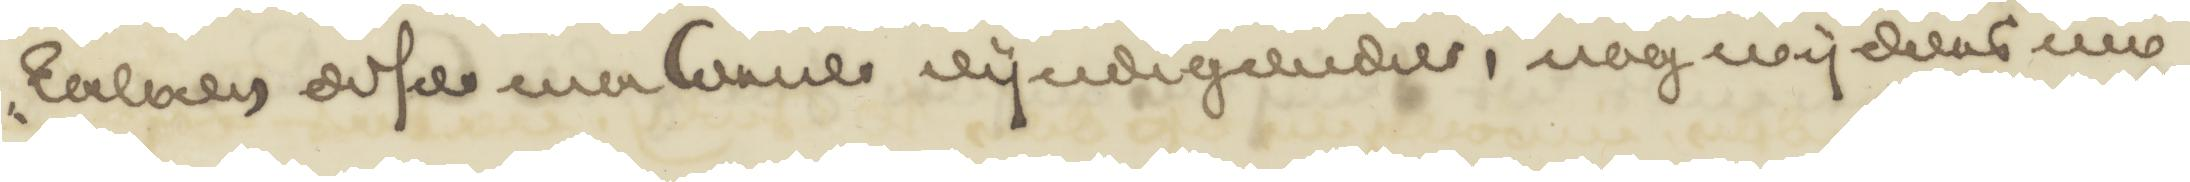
„halven dese materie eijndigende, nog wijders uw
